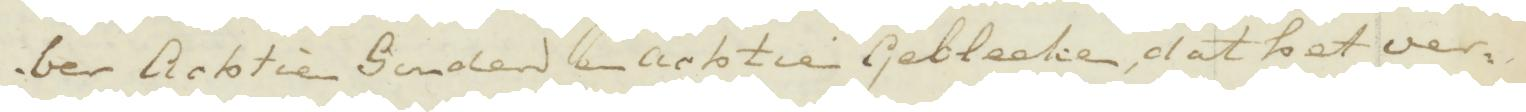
=ber Achtien honderd en achtien Gebleeke, dat het ver=
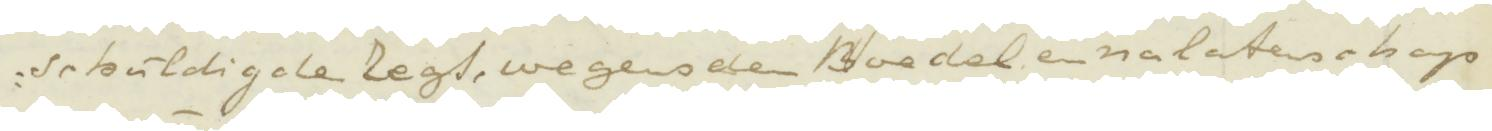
=schuldigde Regt, wegens de Boedel en nalatenschap
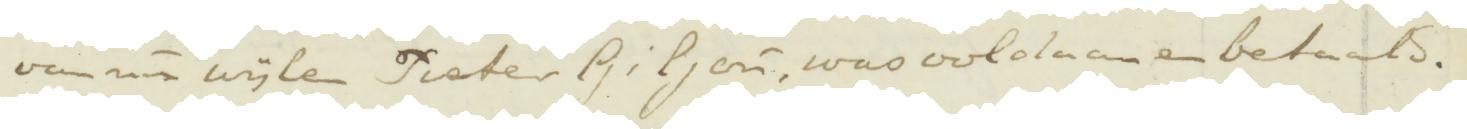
van nu wijlen Pieter Giljou, was voldaan en betaald.
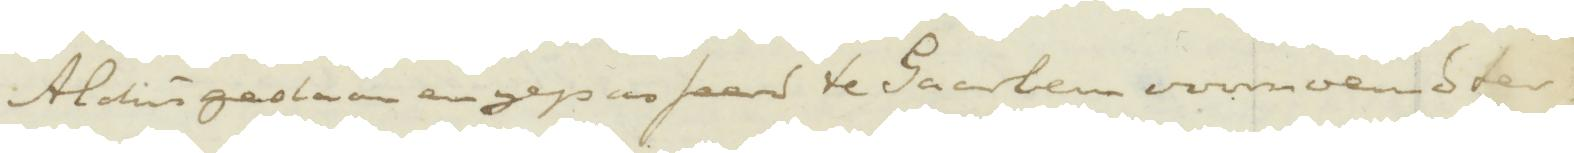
Aldus gedaan en gepasseerd te Haarlem voornoemd ter
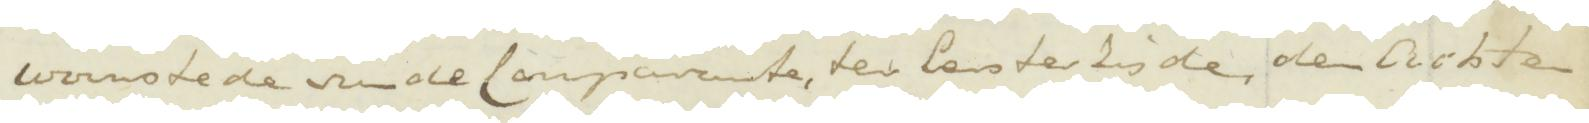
woonstede van de Comparante, ter lester zijde, de Achten
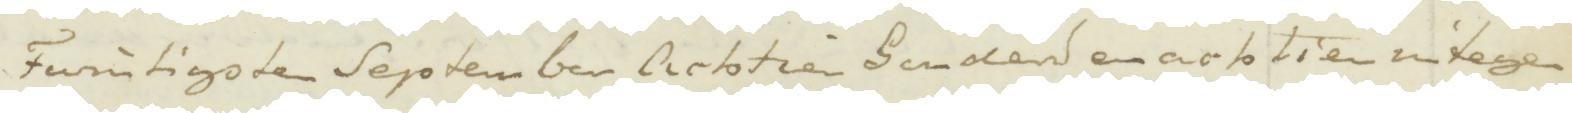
Twintigste September Achtien Honderd en achtien in tegen
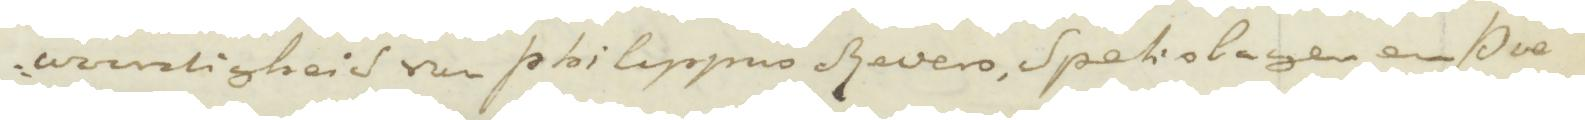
=woordigheid van philippus Revers, Spekslager en Pie
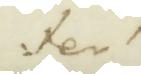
=ter
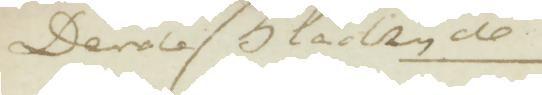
Derde Bladzijde
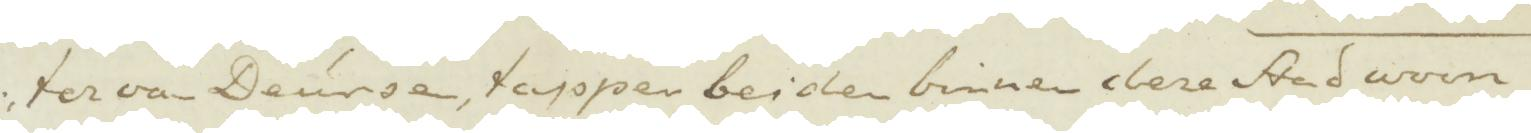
=ter van Deursen, tapper beiden binnen deze stad woon
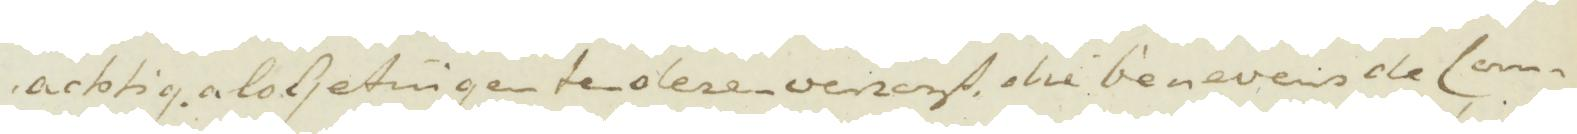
,achtig, als Getuigen ten dezen de Com=
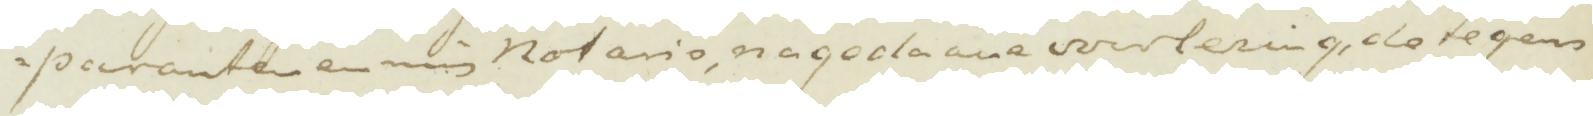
=paranten en mij Notaris, nagedaane voorlezing, de tegens
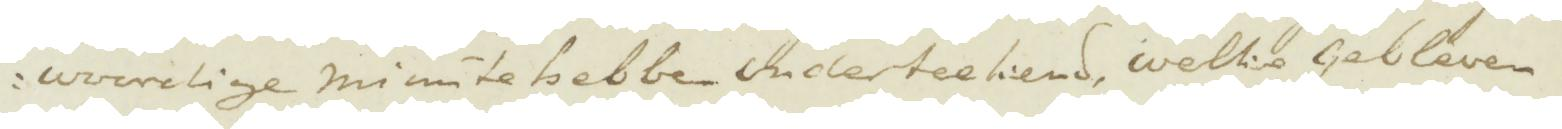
=woordige minute hebben onderteekend, welke gebleven
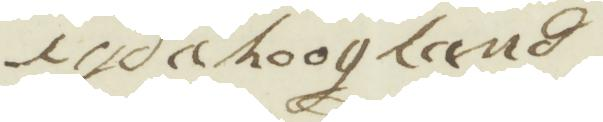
egda hoogland
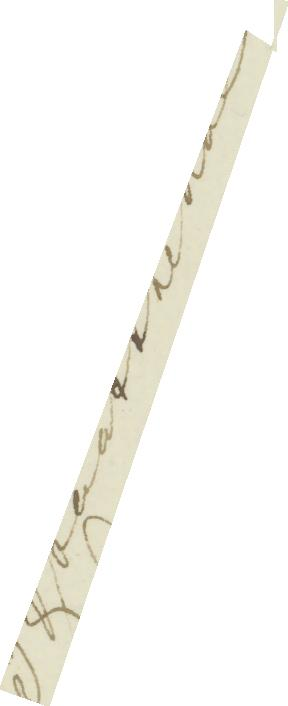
3v laatste hal
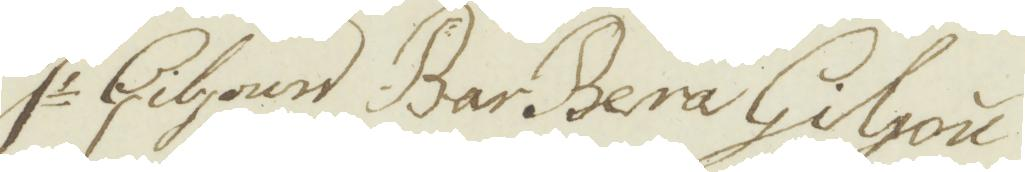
P=s Giljouw Bar Bera Giljou
